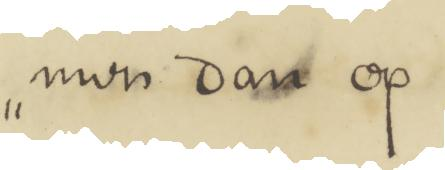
men dan op
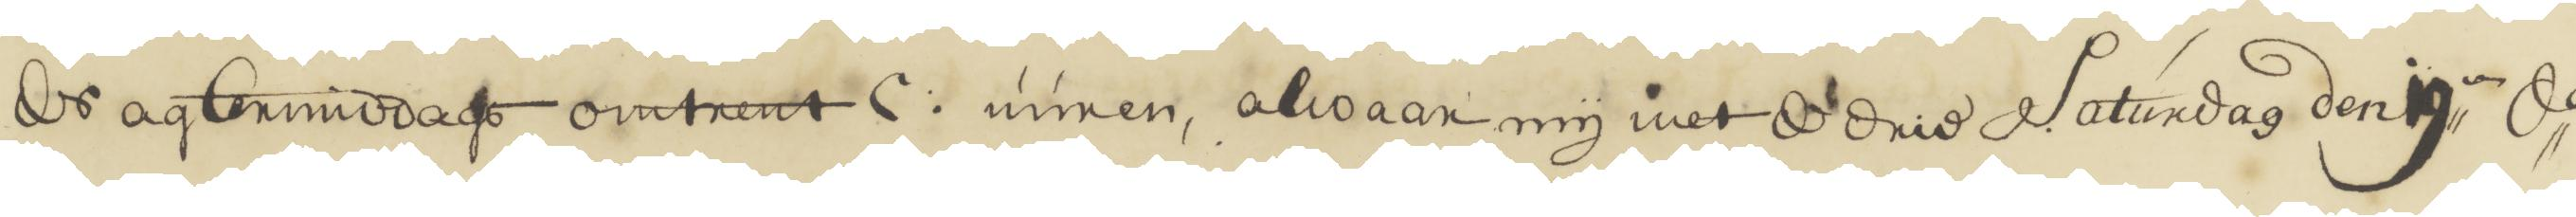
des agtermiddags omtrent 5: uuren, alwaar mij met de drie Saturdag den 19„en d„o
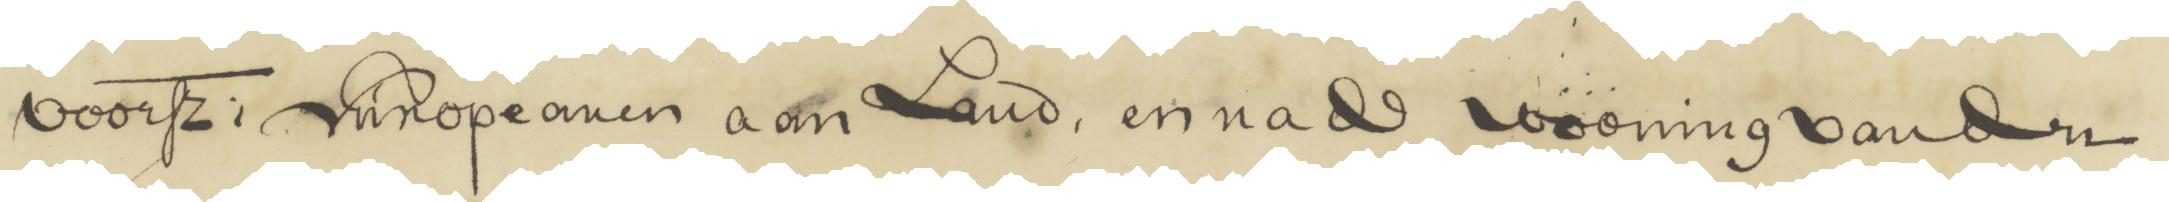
voorsz: Europeanen aan Land, en na de wooning van den
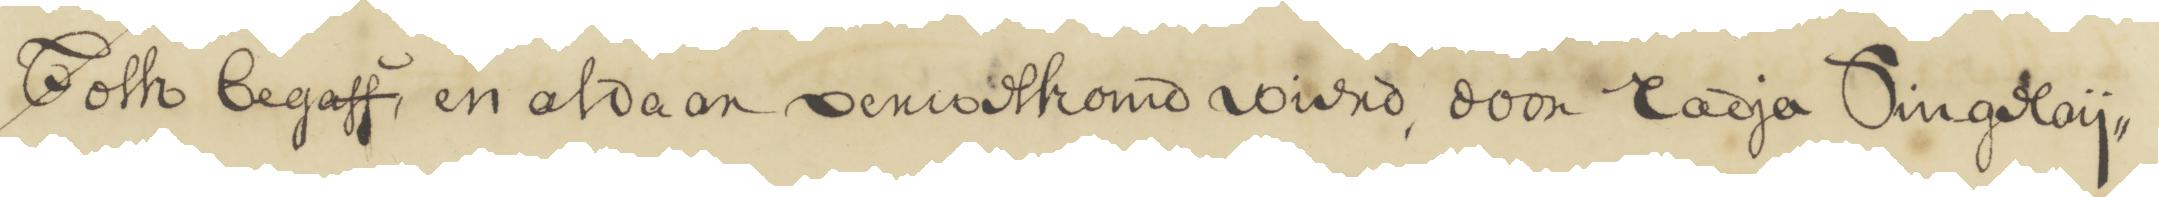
Tolk begaff, en aldaar verwelkomd wierd, door radja Singelaij„
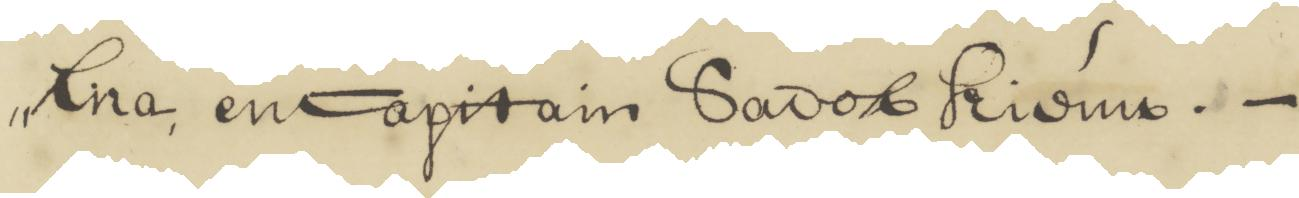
„kna, en capitain Sadok kieuw. —
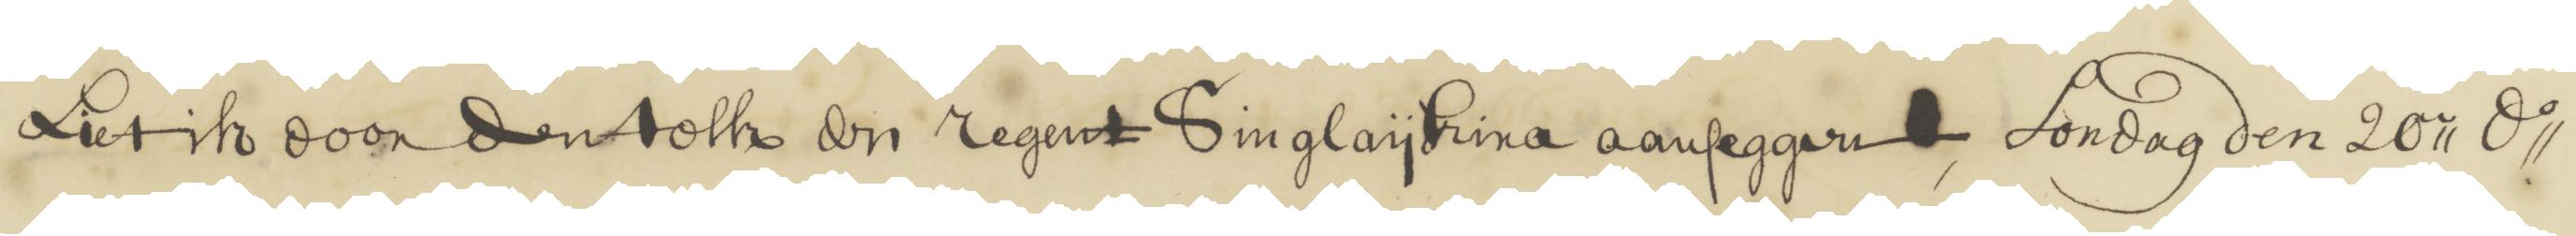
Liet ik door den tolk den regent Singlaijkira aanseggen, Sondag den 20„n d„o
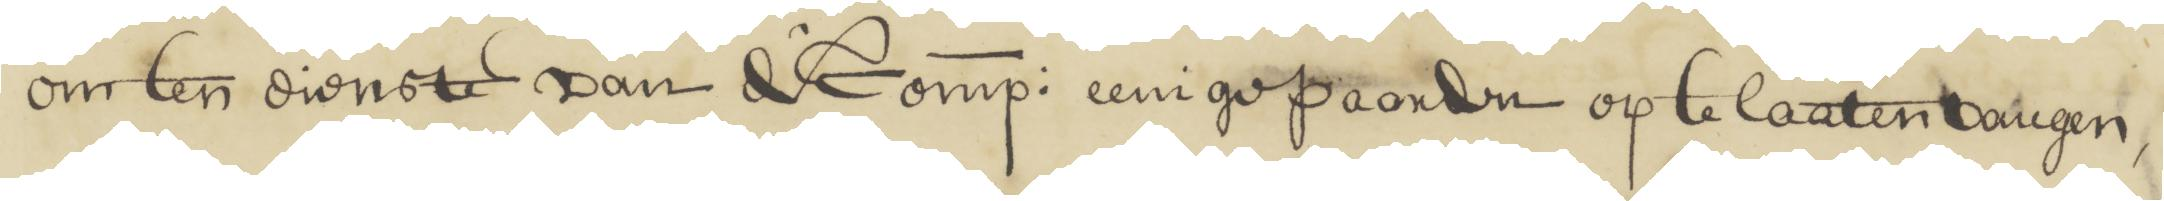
om ten dienste van d'EComp: eenige paarden op te laaten vangen,
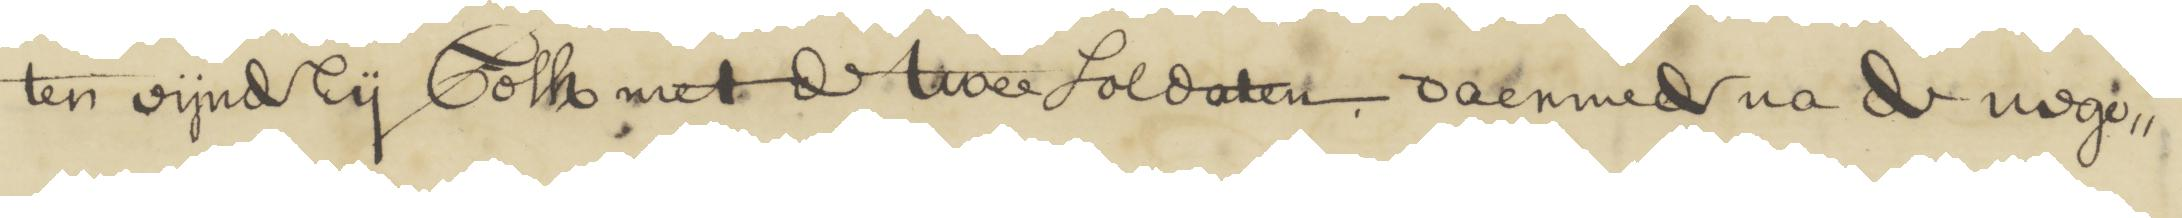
ten eijnde hij Tolk met de twee soldaten, daermede na de nego„
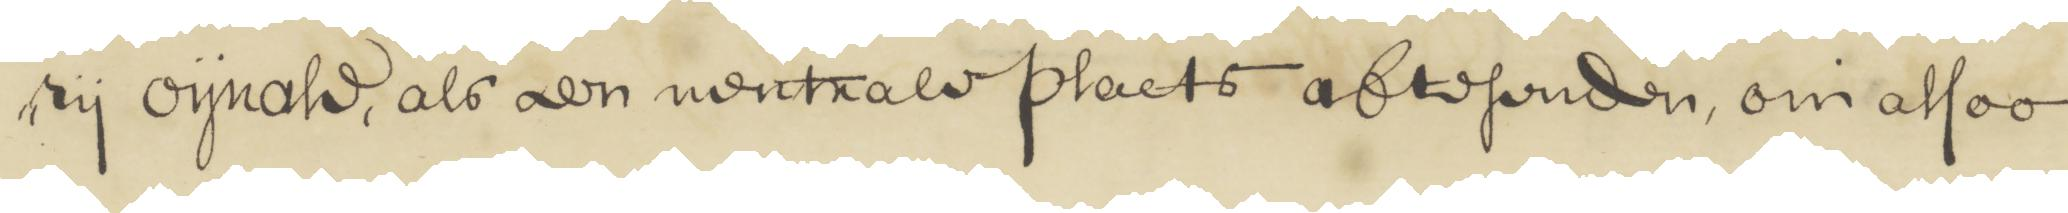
„rij oijnale, als een neutrale plaets aftesenden, om alsoo
